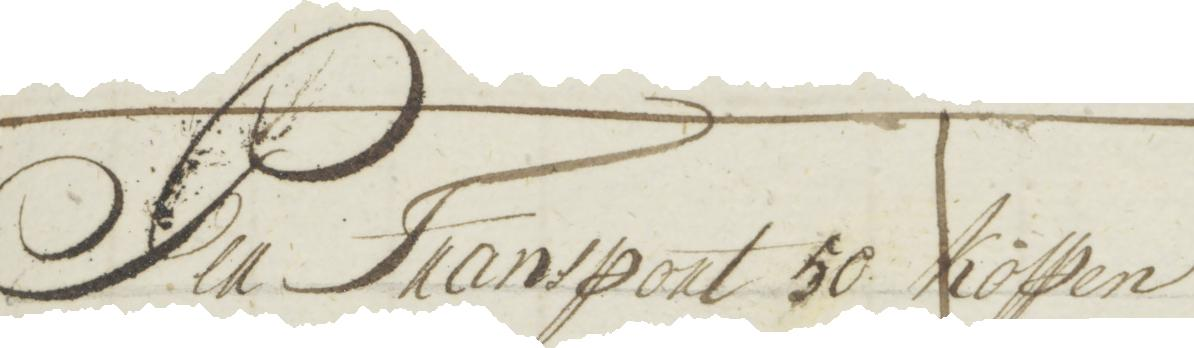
Per Transport 50 koppen
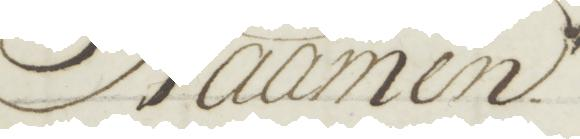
Naamen.
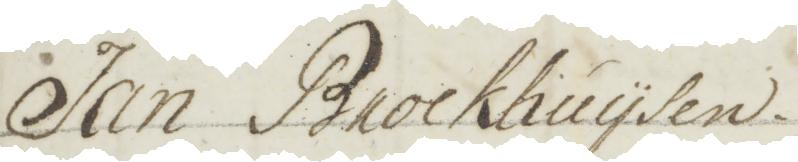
Jan Broekhuijsen-
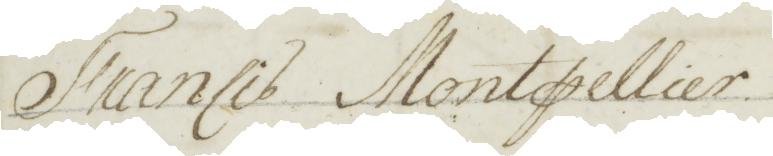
Francis Montpellier
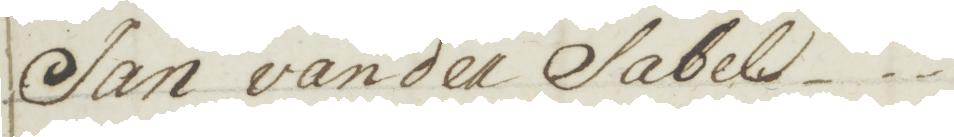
Jan van der Sabel - - -
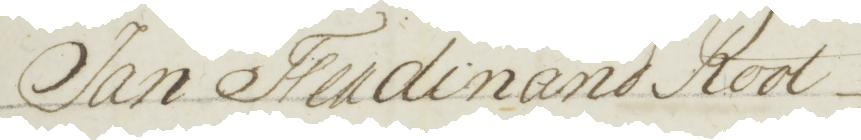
Jan Ferdinand Root -
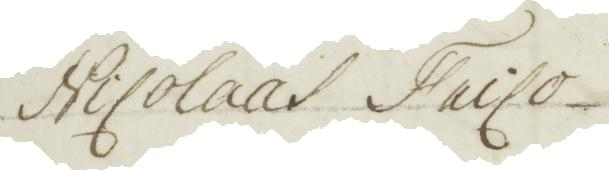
Nicolaas Frico
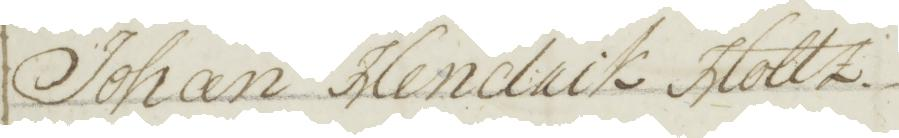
Johan Hendrik Holtz.
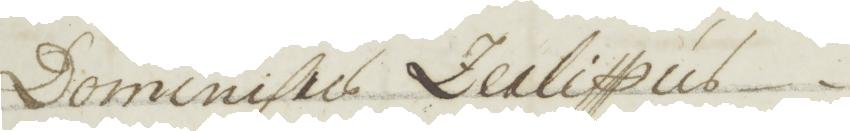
Dominicus Zerlippus - -
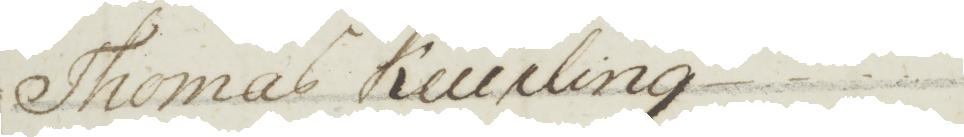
Thomas Keurling - - -
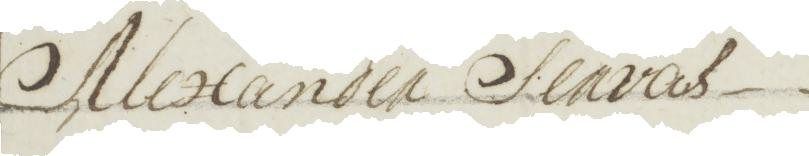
Alexander Servas -
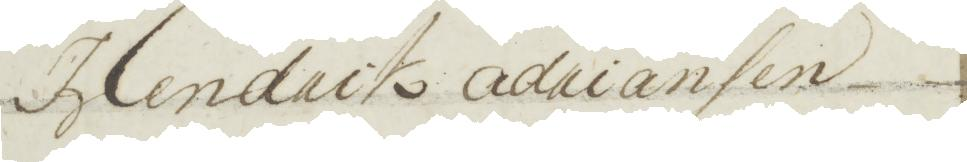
Hendrik adriansen - -
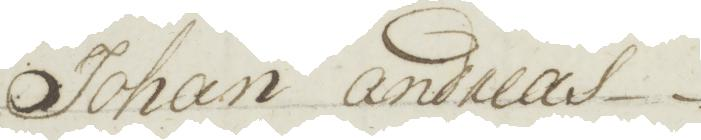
Johan andreas - -
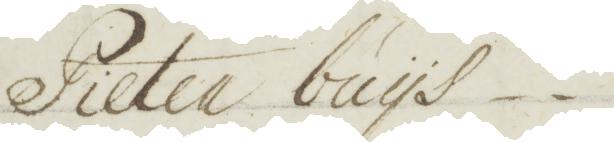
Pieter buijs - -
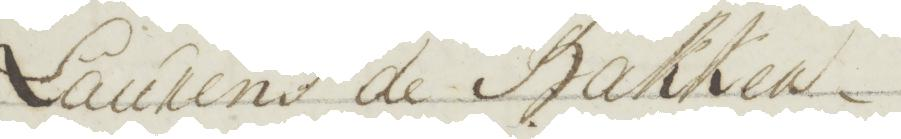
Laurens de Bakker -
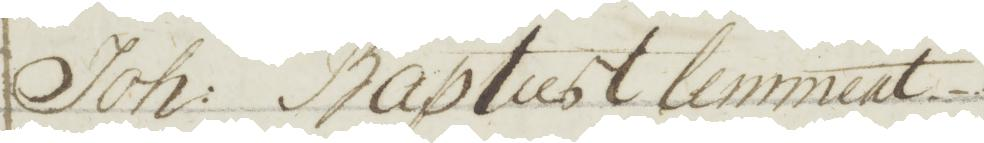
Joh: Baptiest lemmert - -
